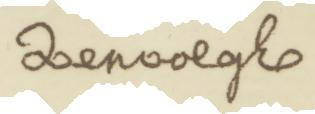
vervolgh
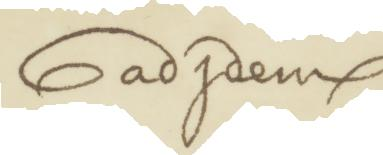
ad jdem
